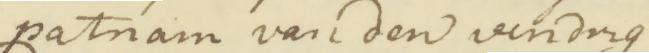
patnam van den vendrig
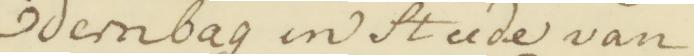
dernbag in steede van
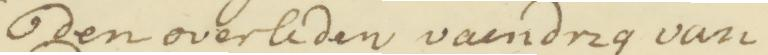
den overleden vaendrig van
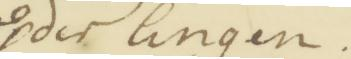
der lingen.
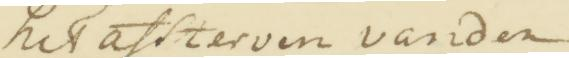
het afsterven vander
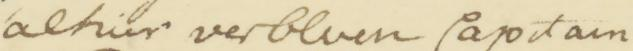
alhier verblven Capitain
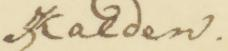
Kalden.
